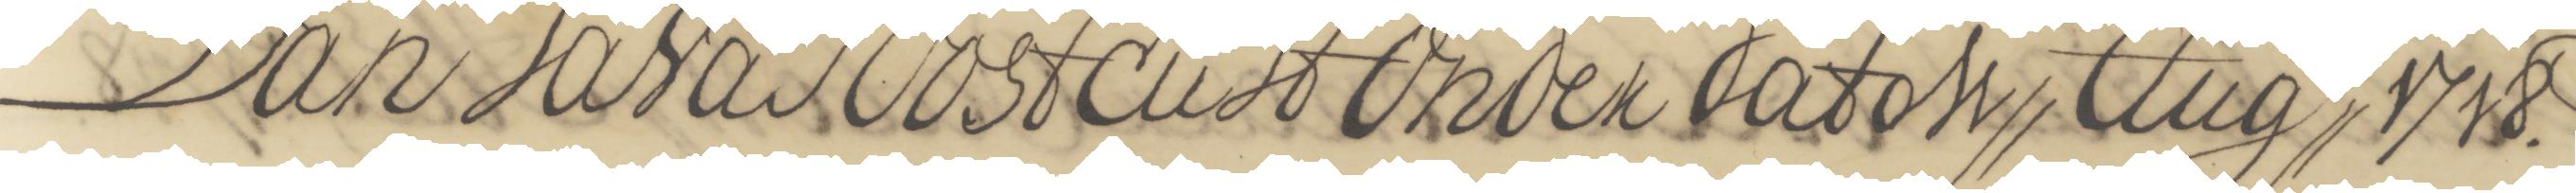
Van Java's Oost cust Onder dato 11„en Aug„s 1718.
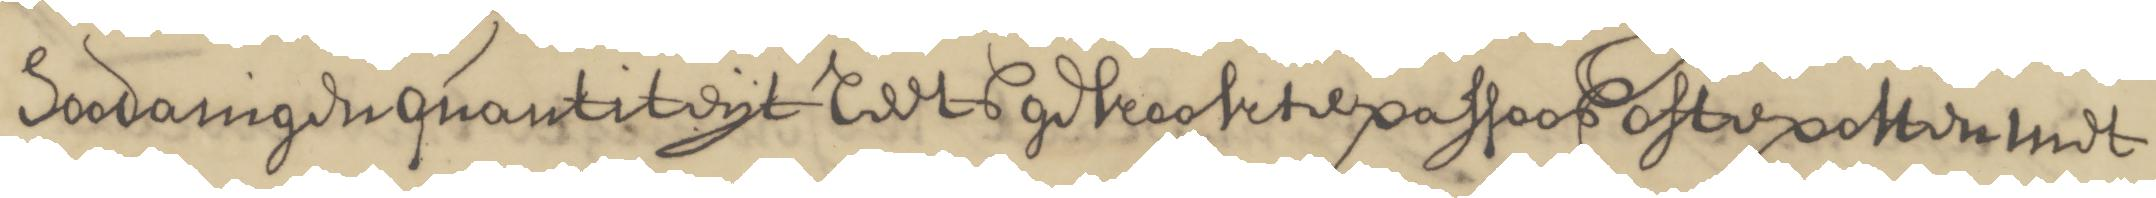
soodanigen quantiteijt reets gekookte passoos ofte potten met
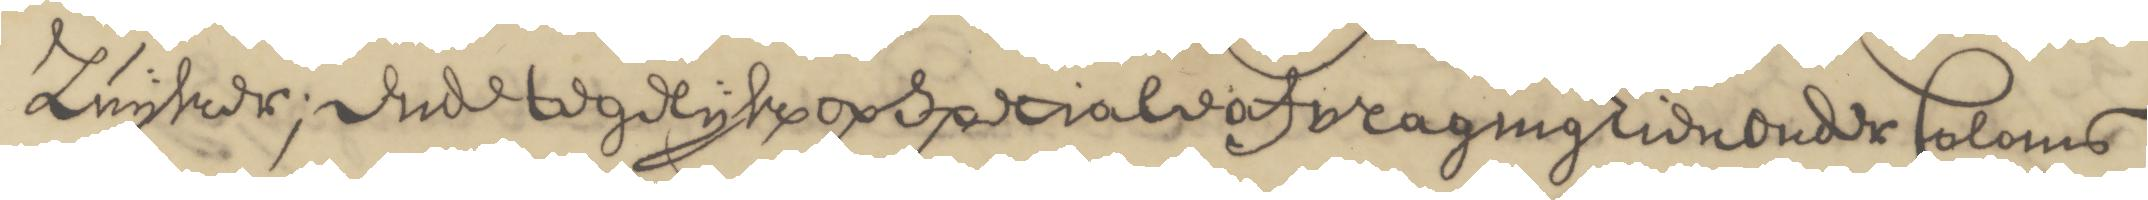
Zuijker; ende tegelijk op speciale afvraging hier onder Coloms
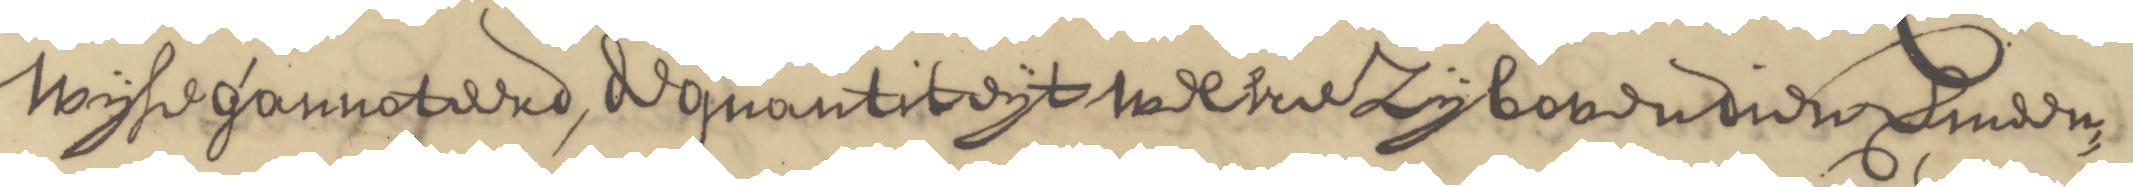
wijse g'annoteerd, de quantiteijt welke Zij boven dien vermeen„
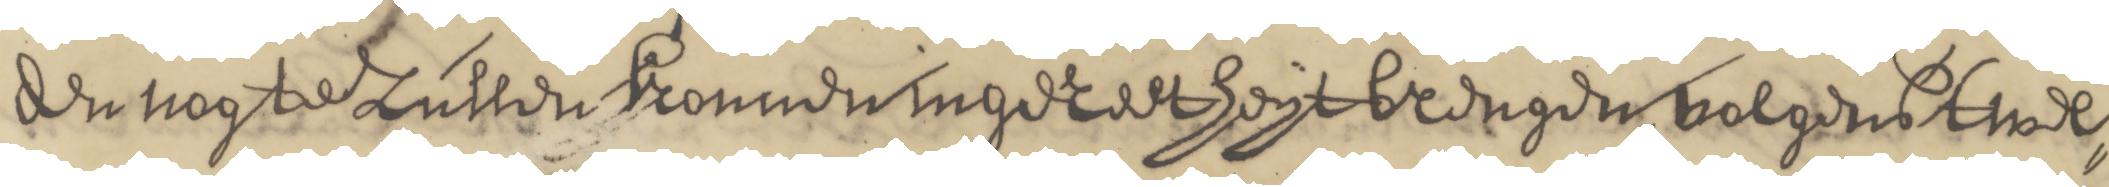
den nog te Zullen konnen ingereetheijt brengen, volgens 'twel„
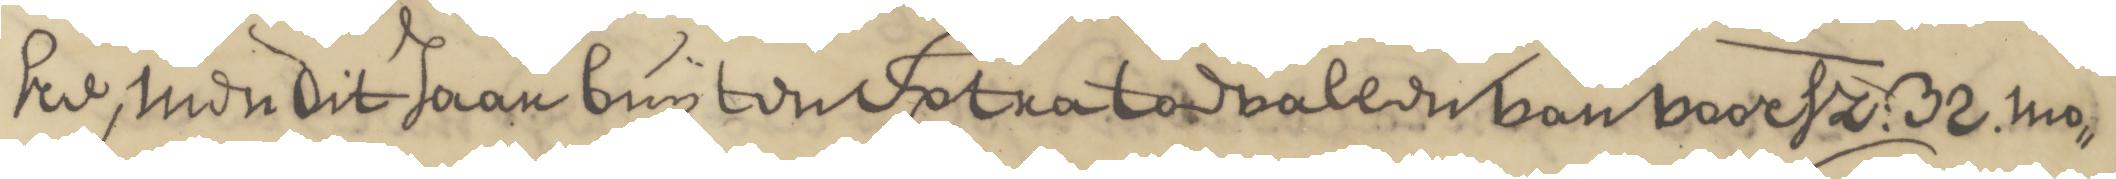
ke, men dit Jaar buijten Extra toevallen van voorsz: 32. mo„
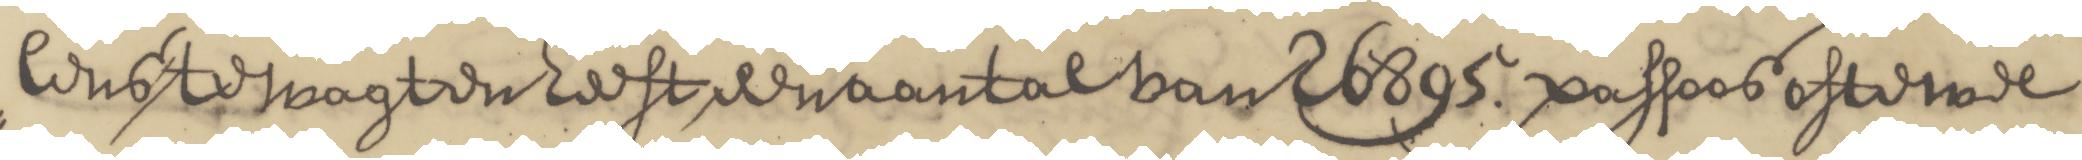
lens te wagten heeft, een aantal van 26895: passoos ofte wel
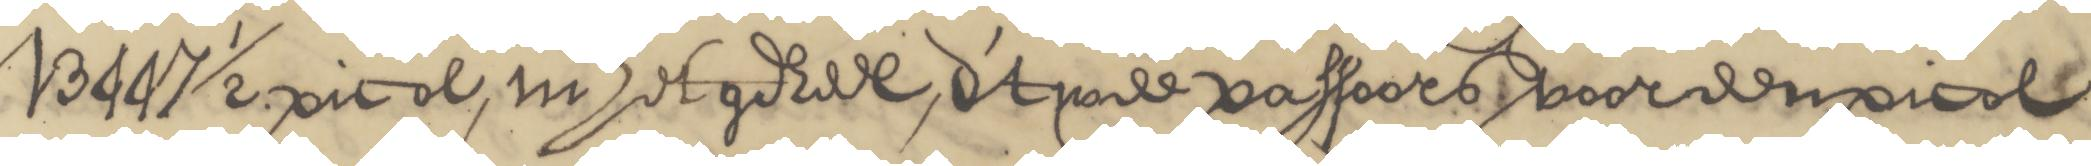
13447½. picol, in het geheel, d'twee passoors voor een picol
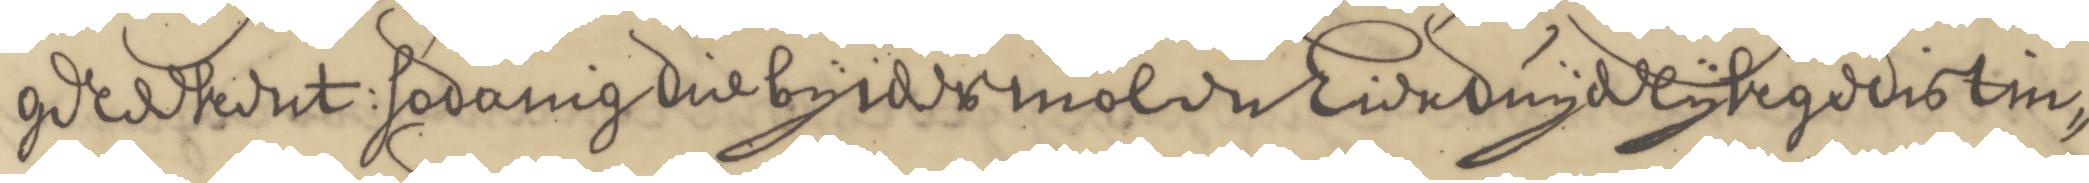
gereekent: Sodanig die bij ider molen hier duijdelijk gedistin„
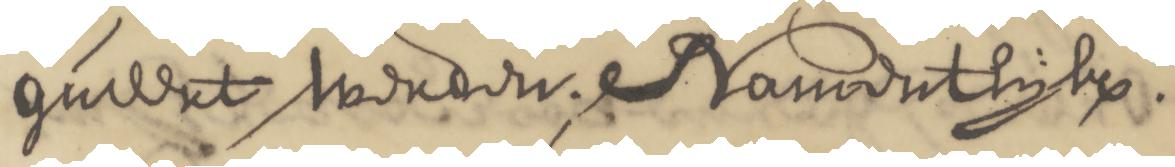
gueert werden. Namentlijk.
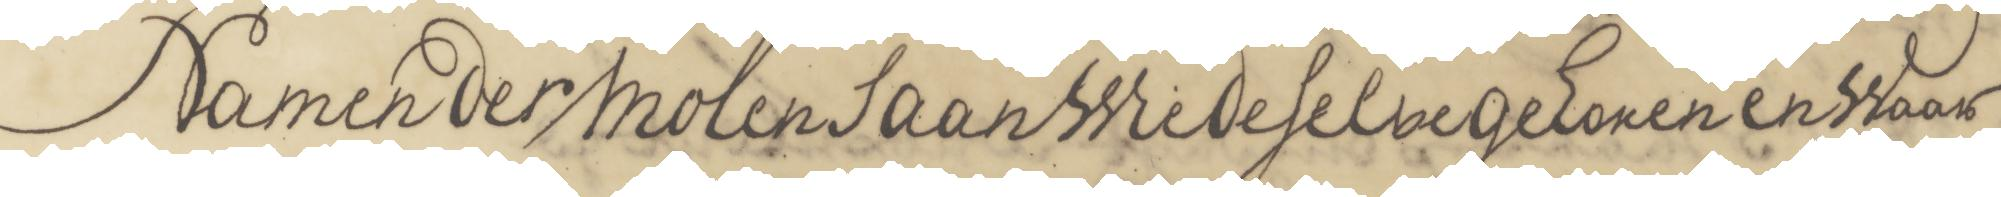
Namen der molens aan wie deselve gehoren en Waar
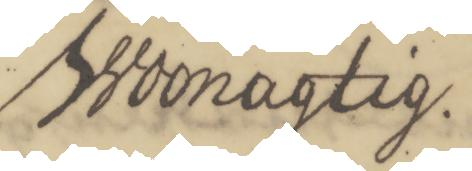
Woonagtig.
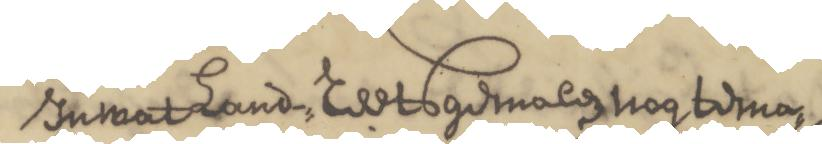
In wat Land- reets gemalen nog te ma„
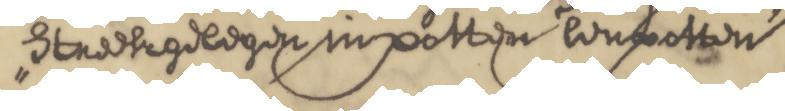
„streek gelegen in potten len potten
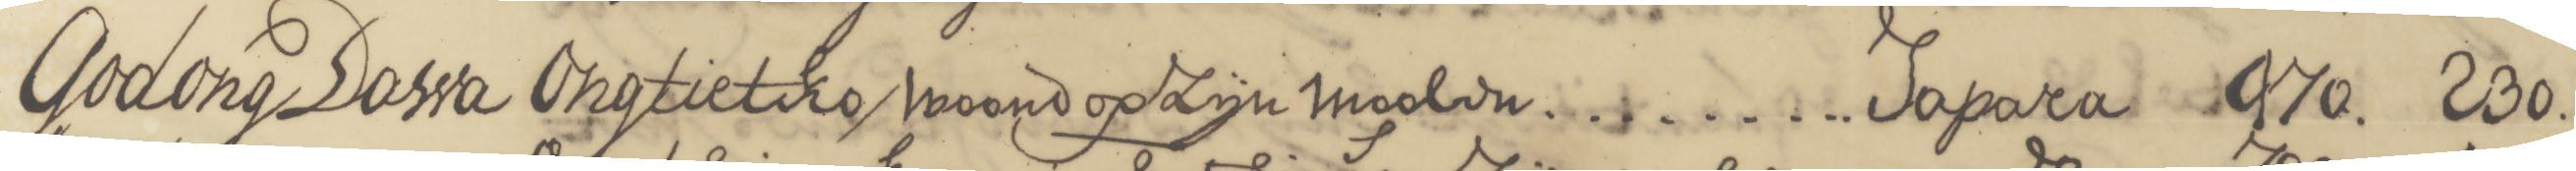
Godong Dawa Ongtieko, woond op Zijn moolen . . . . . . . . . Japara 470. 230.
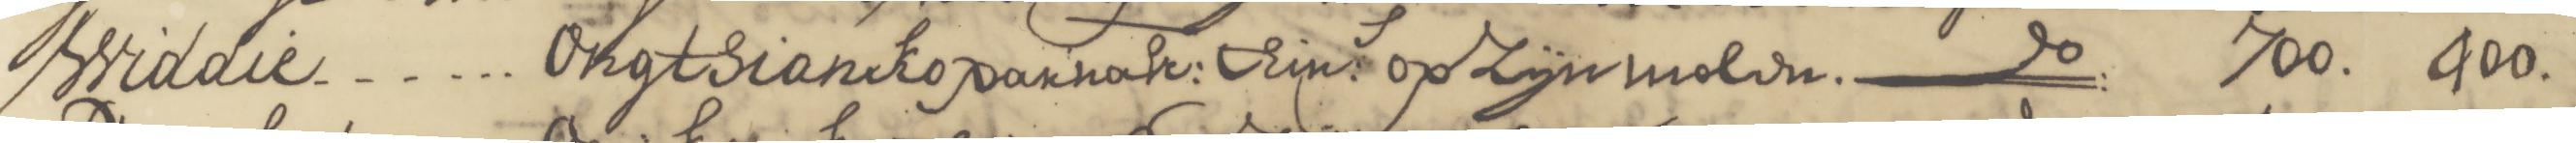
Widdie - - - - - - Ongtsianko parnak: chin:s op Zijn molen . d=o: 700. 400.
